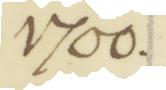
1700.
